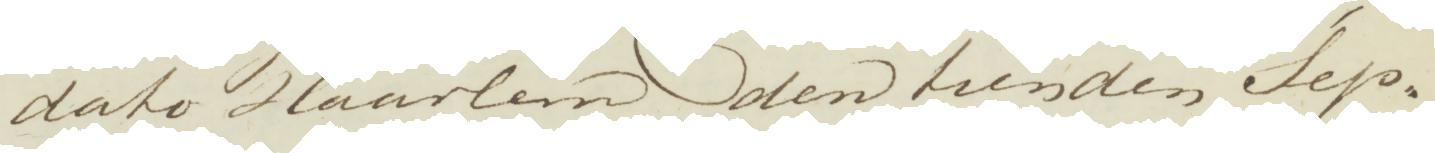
dato Haarlem den tienden Sep„
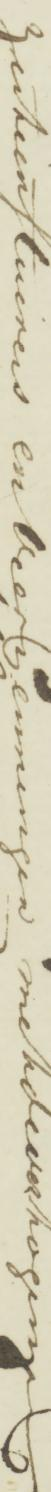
zestien stuivers en vier penningen met de verhoging
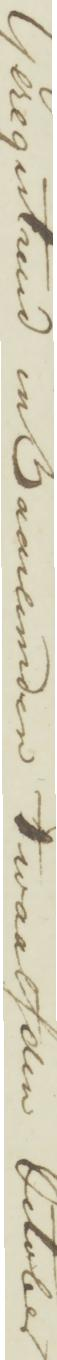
Geregistreerd in Haarlem den Twaalfden October
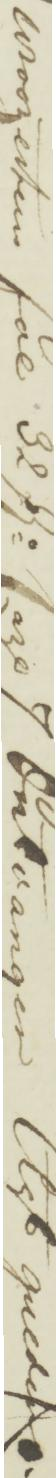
1800zestien fol 32 R=o C no 7 Ontvangen Agt guldens
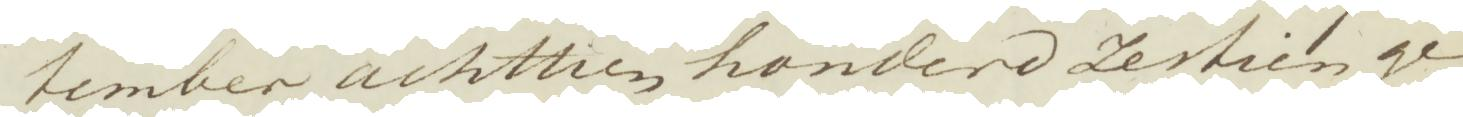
tember achttien honderd zestien ge
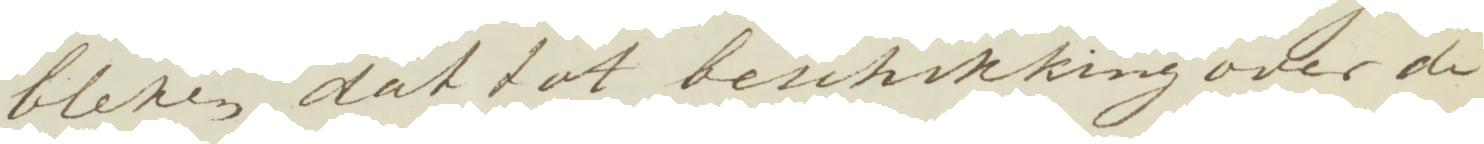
bleken, dat tot beschikking over de
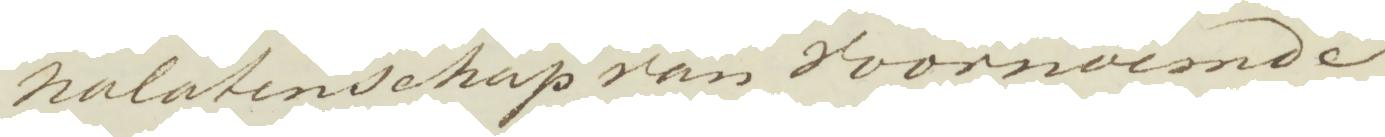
nalatenschap van voornoemde
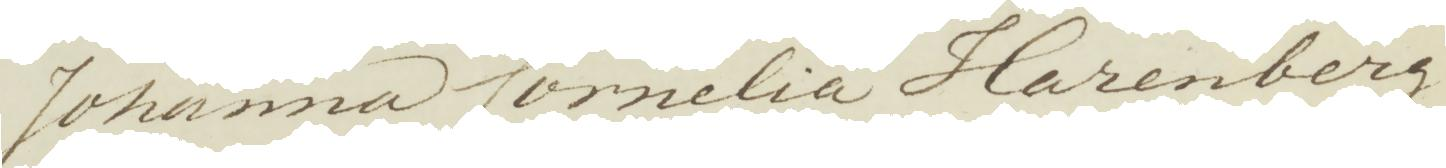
Johanna Cornelia Harenberg
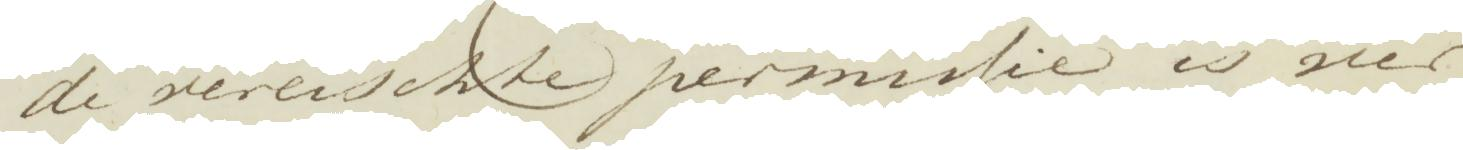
de vereischte permissie is ver
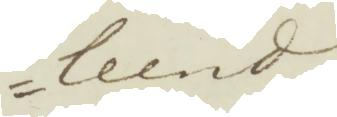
=leend
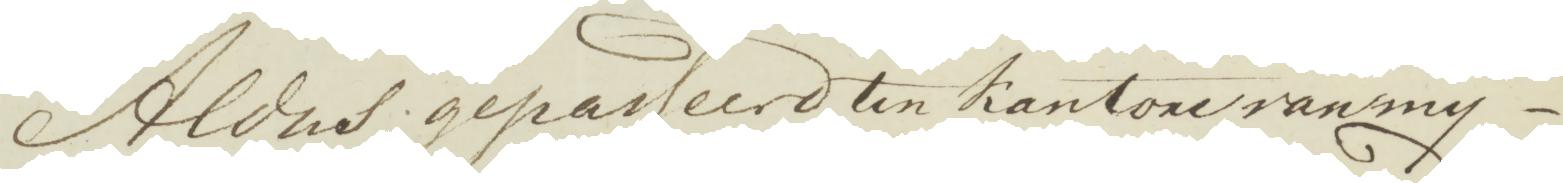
Aldus gepasseerd ten kantore van my –
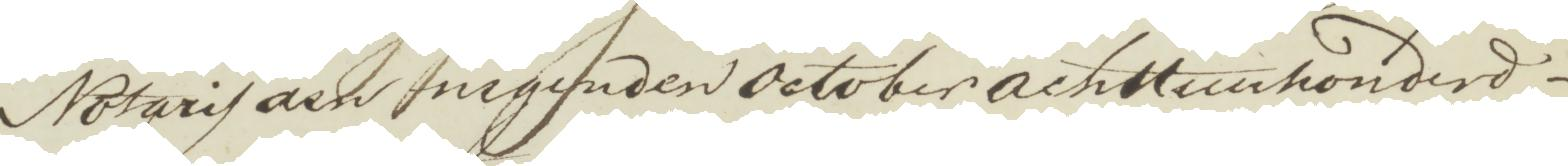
Notaris den negenden October achttienhonderd
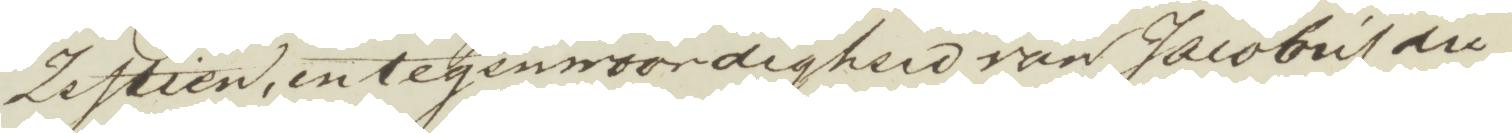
Zestien, in tegenwoordigheid van Jacobus du
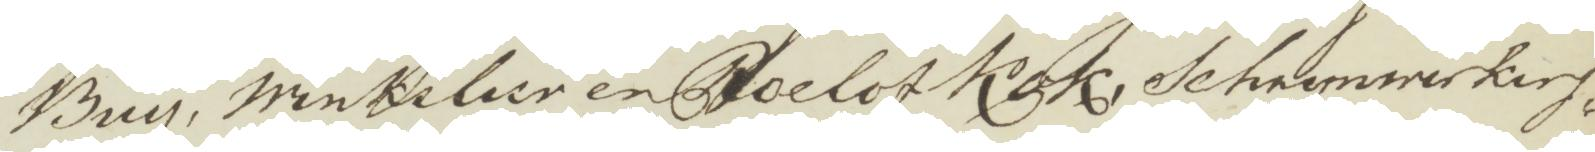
Buy, winkelier en Roelof Kok, Schrynwerkers
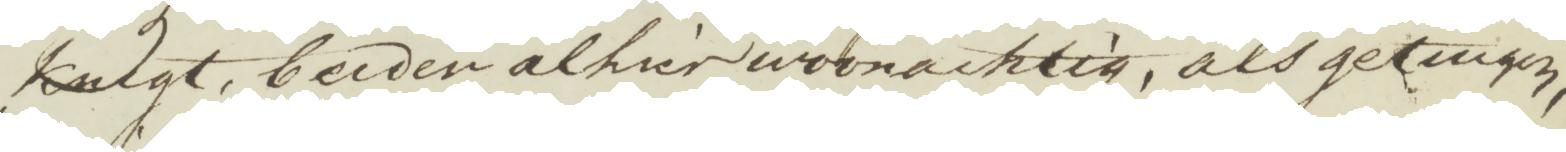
knegt, beiden alhier woonachtig, als getuigen,
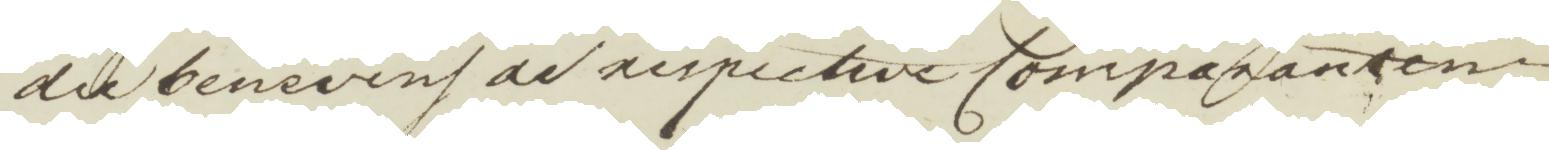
die benevens de respective Comparanten
